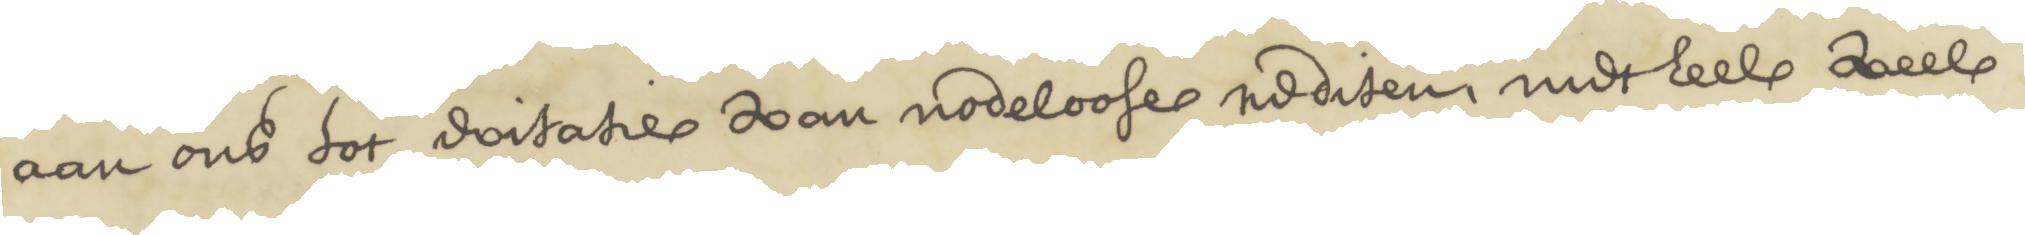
aan ons tot evitatie van nodeloose rediten, met heel veel
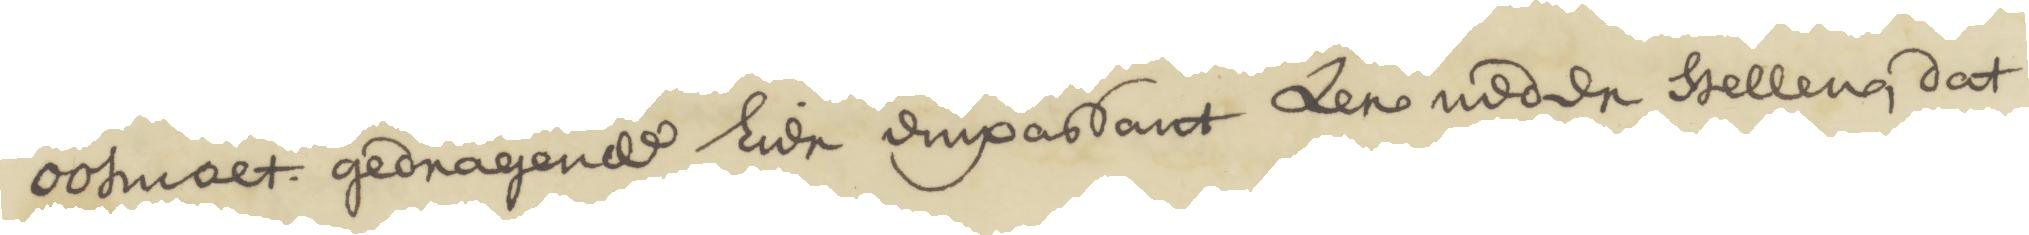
ootmoet gedragende hier empassant ter neder stellen, dat
